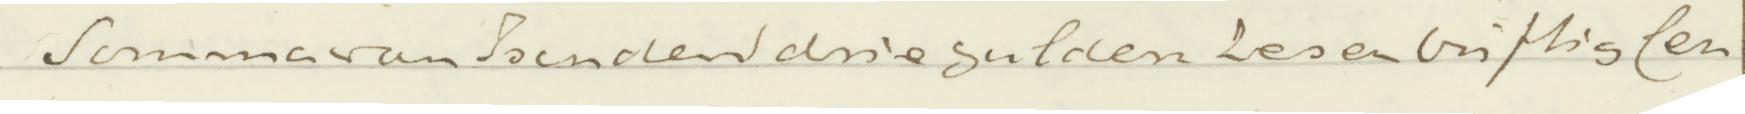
Somma van honderd drie gulden zes en vijftig Cen
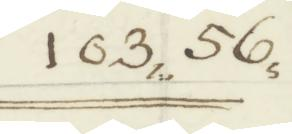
103,„56„
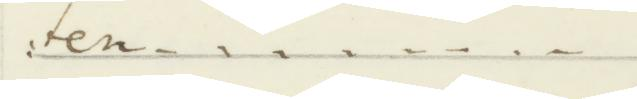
„ten - - - - - - - -
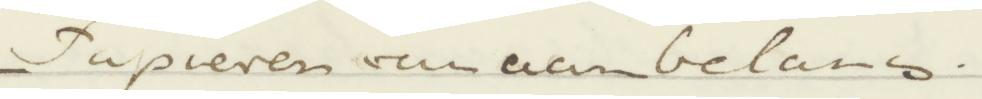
Papieren van aanbelang.
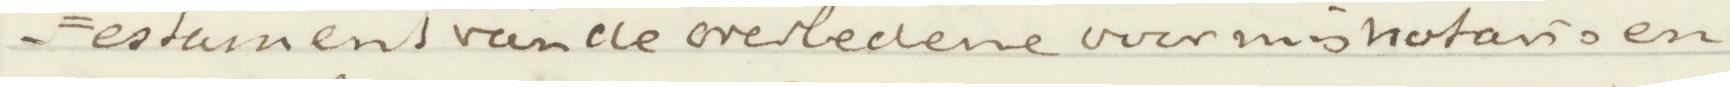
Testament van de overledene voor mij notaris en
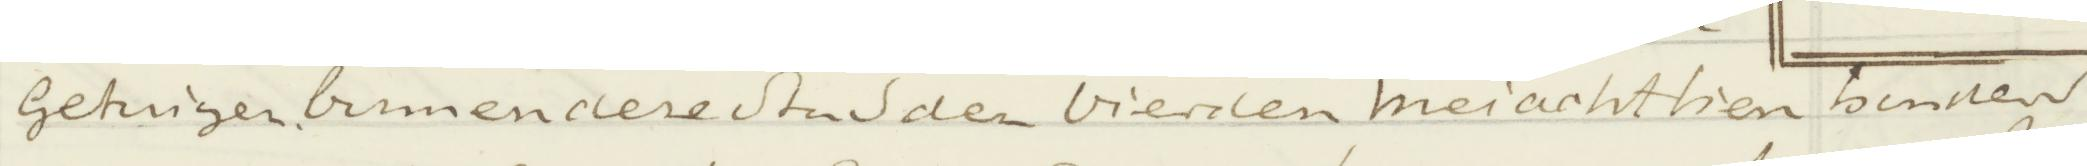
getuigen binnen deze stad den vierden mei achttien honderd
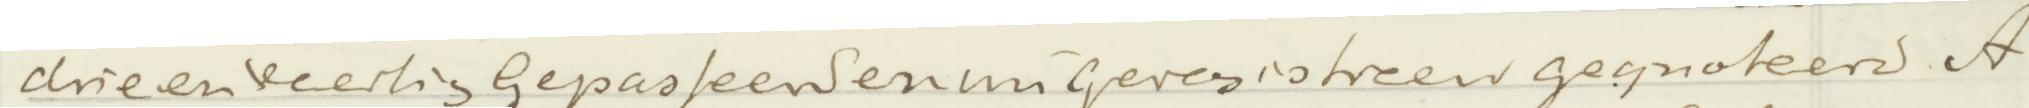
drie en veertig gepasseerd en nu geregistreerd gequoteerd A
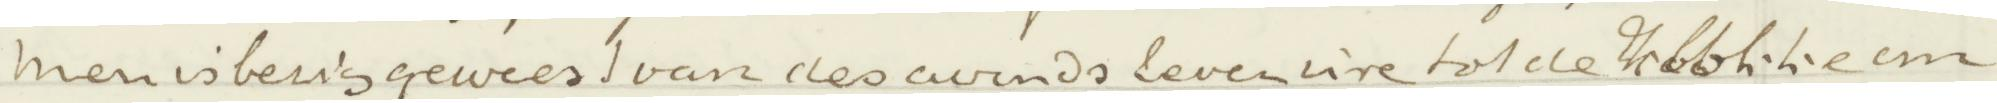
men is bezig geweest van des avonds zeven ure tot de klokke om
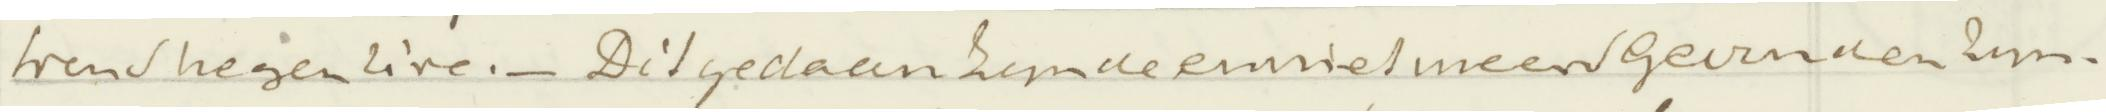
trend negen ure.- Dit gedaan zynde enniet meer gevonden zyn-
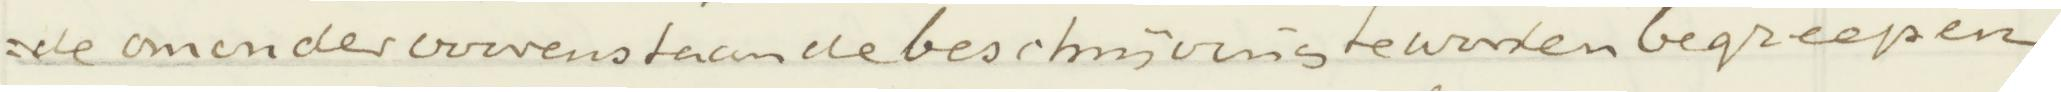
=de om onder voorenstaande beschrijving te worden begreepen
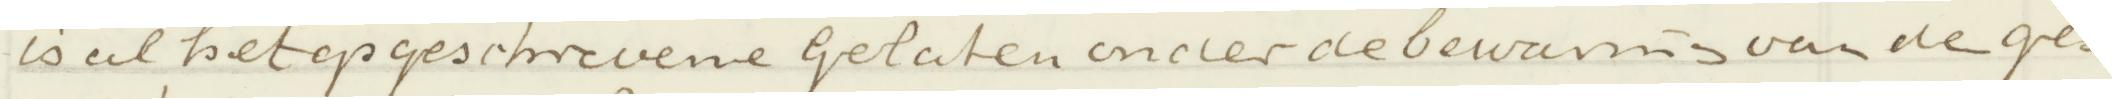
is al het opgeschrevene gelaten onder de bewaring van de ge=
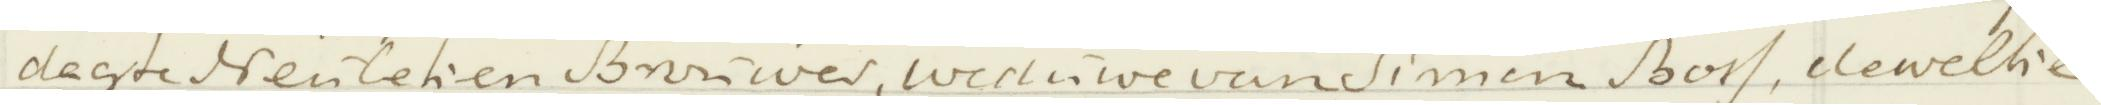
dagte Neuleken Brouwer, weduwe van Simon Boss, dewelke
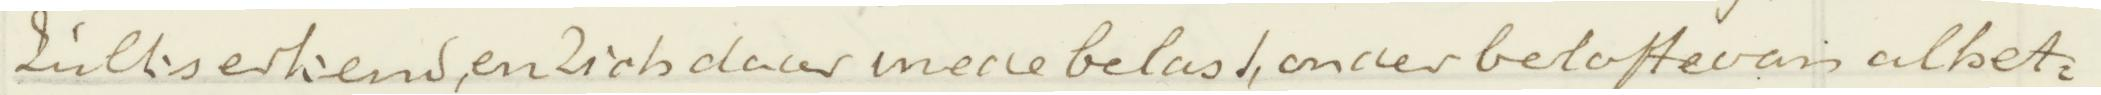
zulks erkend, en zich daar mede belast, onder belofte van al het=
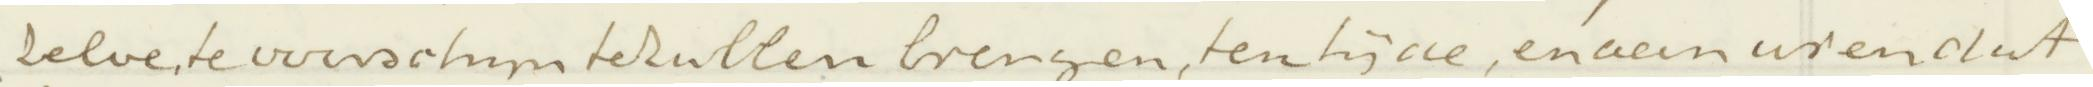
zelve te voorschyn tezullen brengen, ten tijde, en aan wien dat
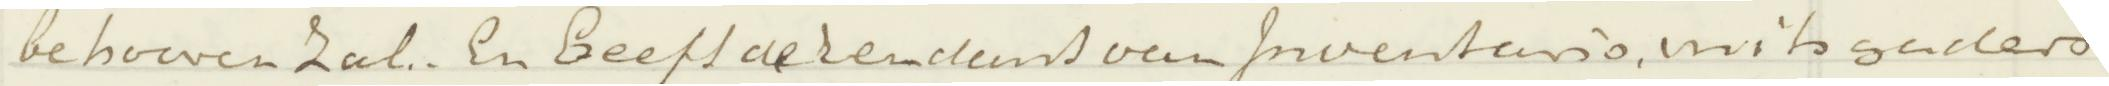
behooren zal.. En heeft de rendant van Jnventaris, mitsgaders
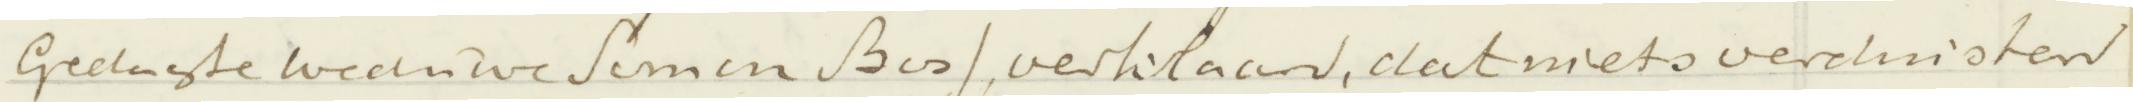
Gedagte weduwe Simon Boss, verklaard, dat niets verduisterd
